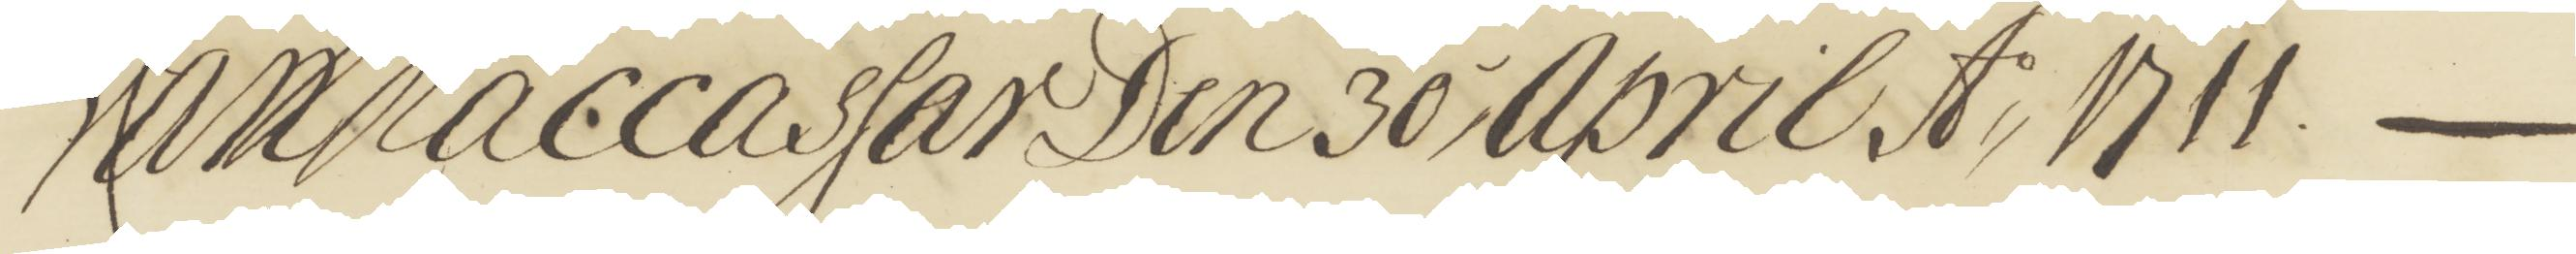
Van Maccassar Den 30„' April A„o 1711.—
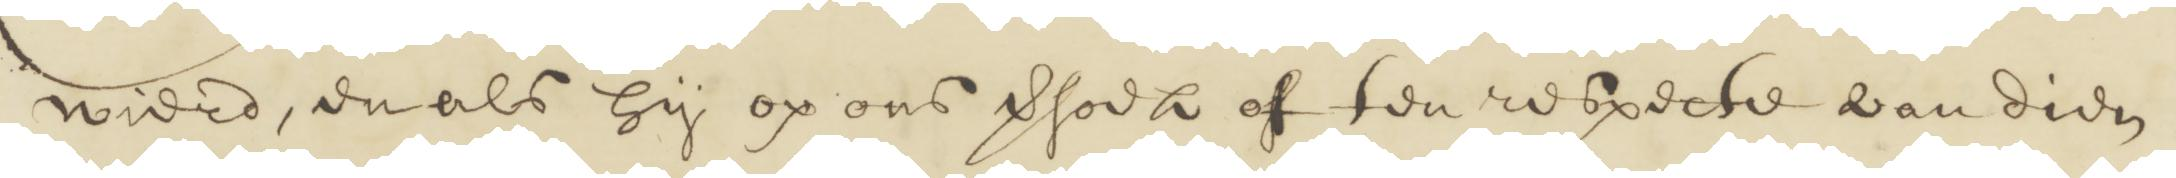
wierd, en als hij op ons versoek of ten respecte van dien
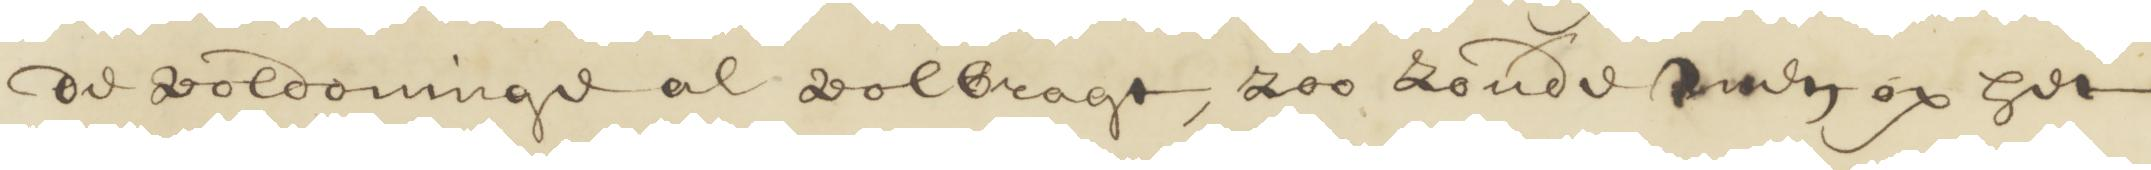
de voldoninge al volbragt, zoo zoude men op het
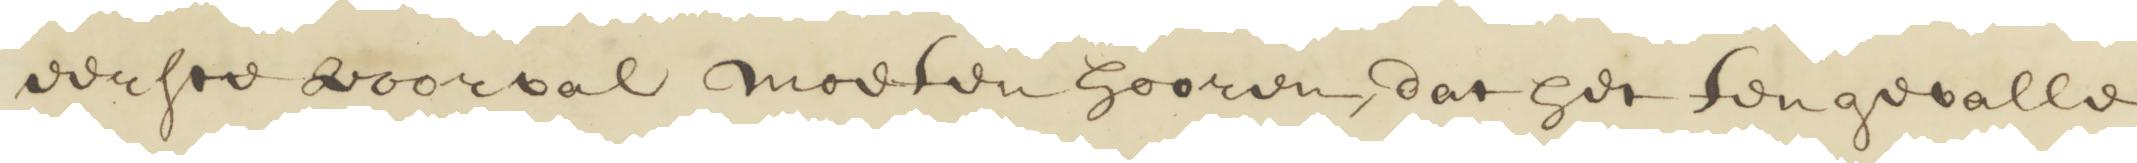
eerste voorval moeten hooren, dat het ten gevalle
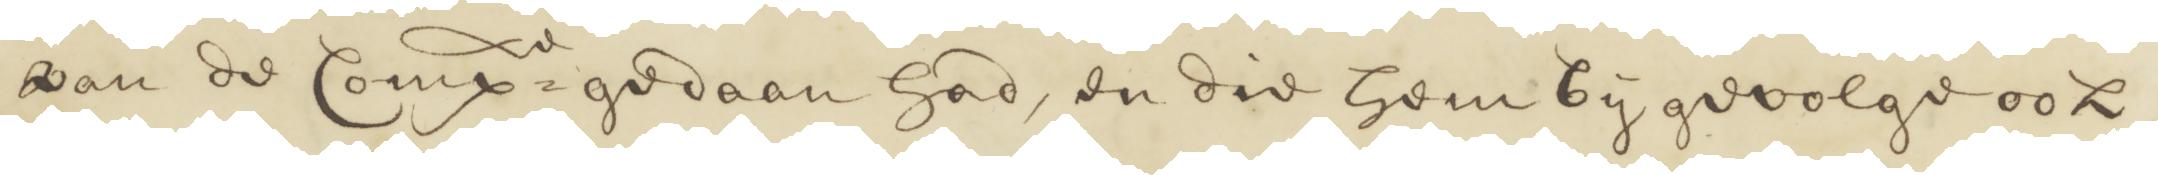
van de Comp=e gedaan had, en die hem bij gevolge ook
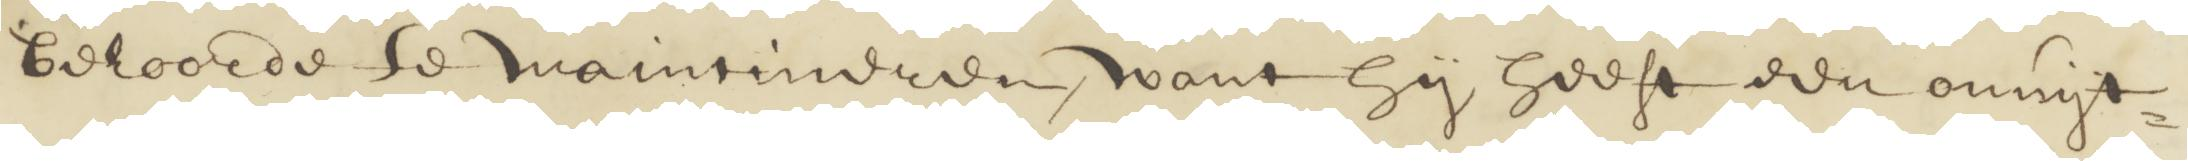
behoorde te maintineren, want hij heeft een onuijt=
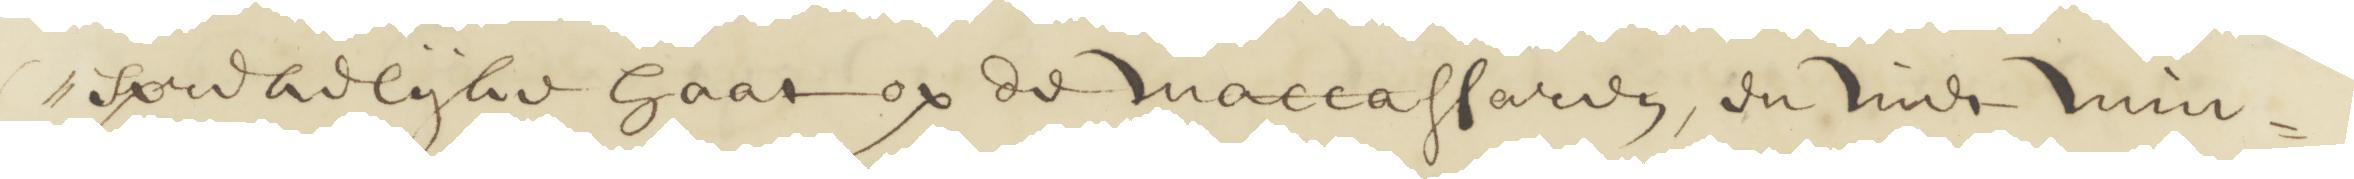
„sprekelijke haat op de maccassaren, en niet min=
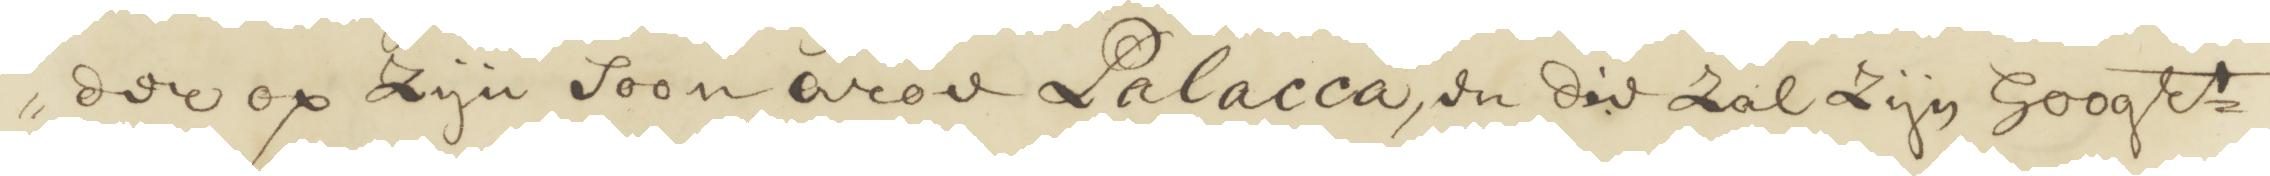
„der op zijn soon aroe Palacca, en die zal zijn hoogh=t
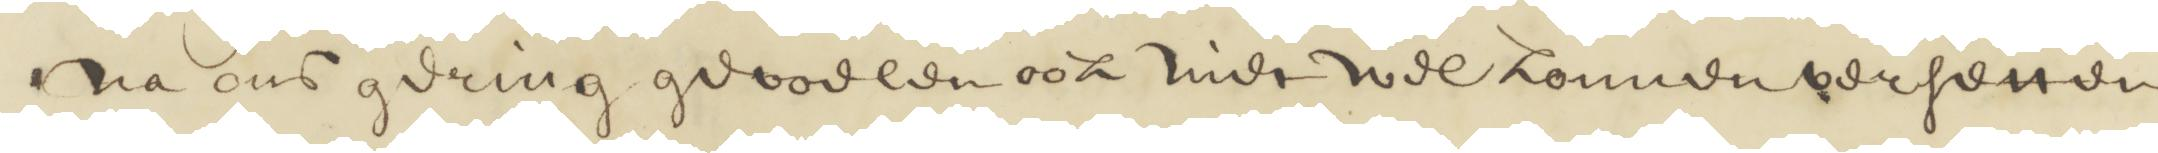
na ons gering gevoelen ook niet wel konnen versetten
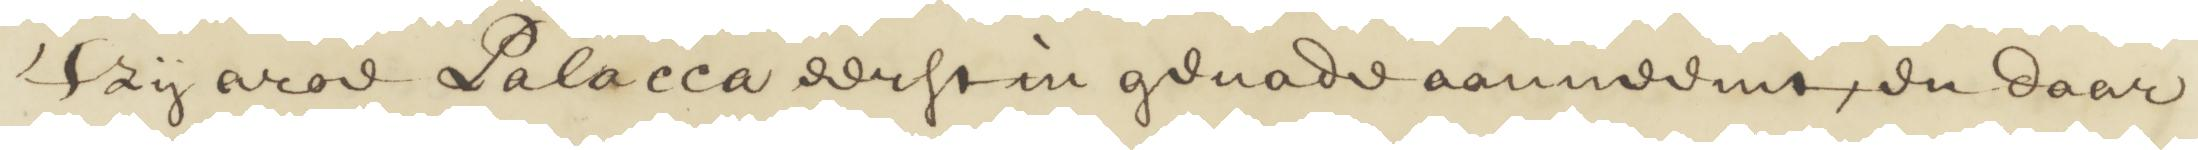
'tzij aroe Palacca eerst in genade aanneemt, en daar
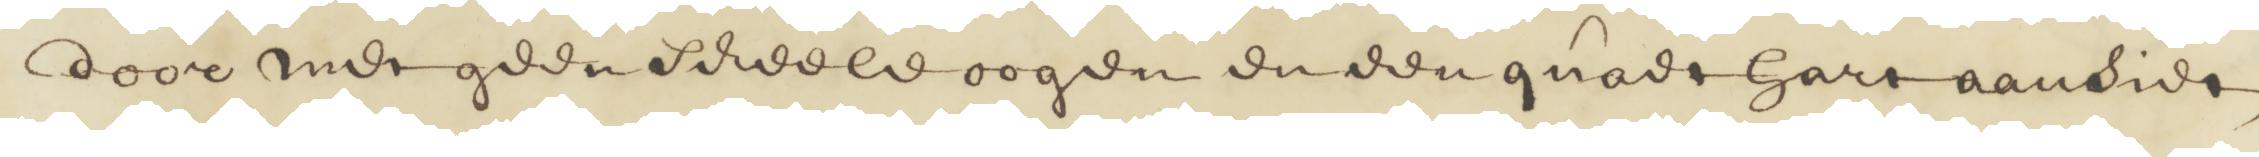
door met geen scheele oogen en een quaet hart aansiet
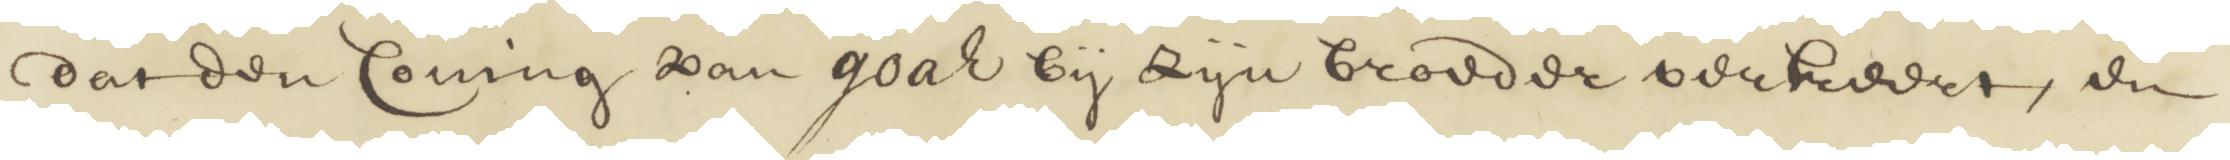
dat den Coning van goah bij zijn broeder verkeert, en
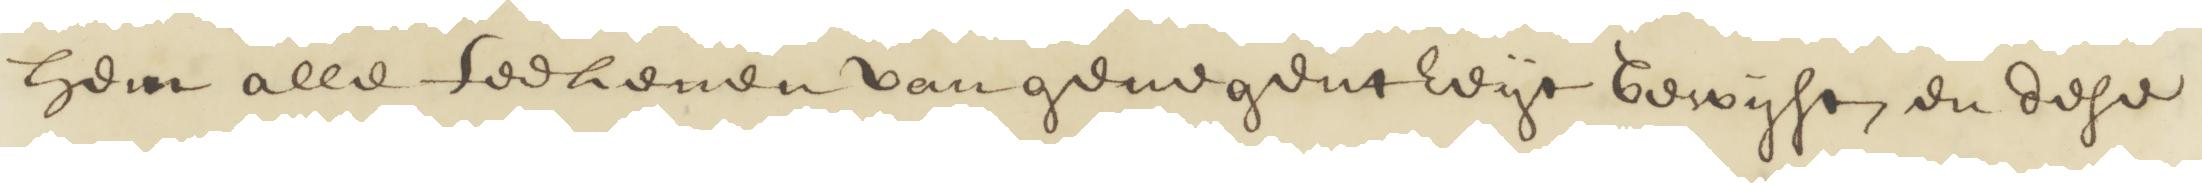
hem alle teekenen van genegentheijt bewijst, en dese
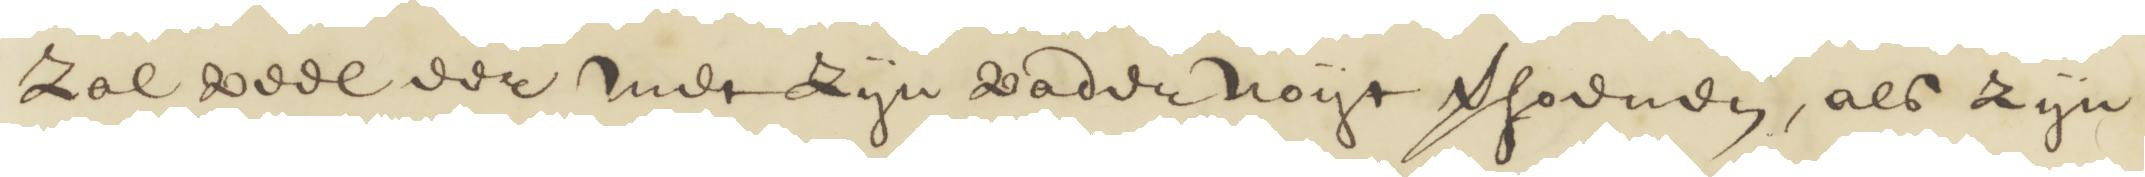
zal veel eer met zijn vader noijt versoenen, als zijn
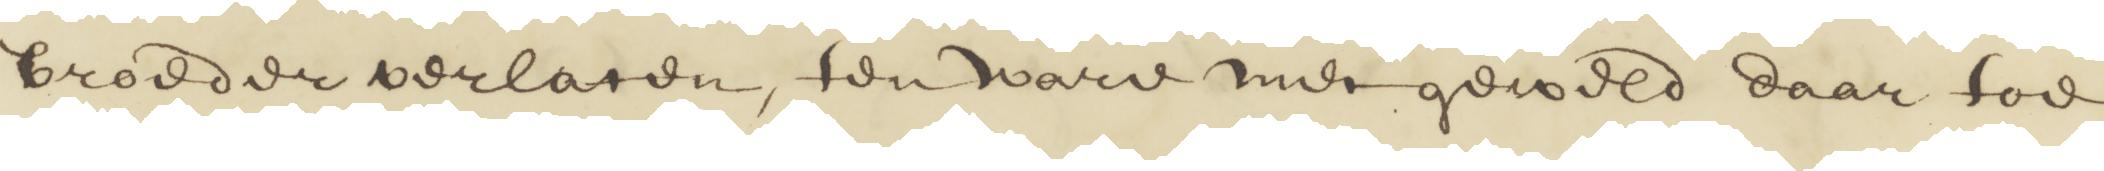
broeder verlaten, ten ware met geweld daar toe
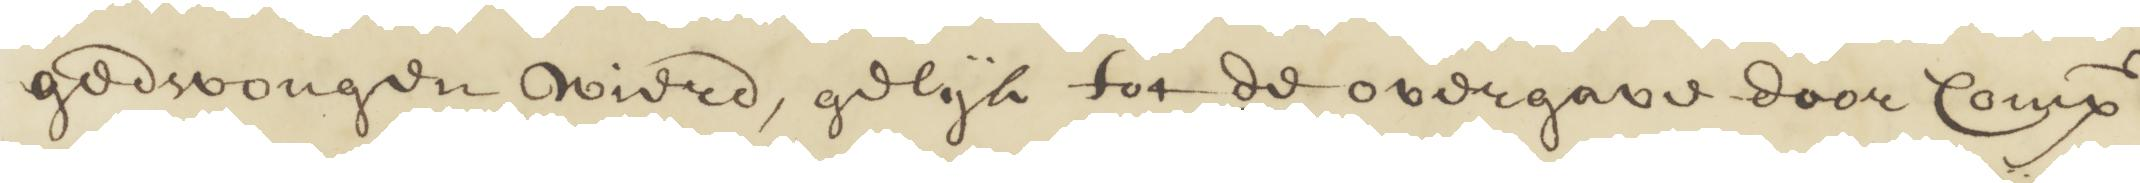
gedwongen wierd, gelijk tot de overgave door Comp:s
